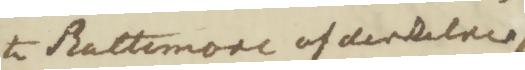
te Baltimore of derzelve
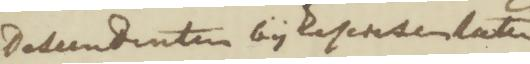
descendenten bij representatie
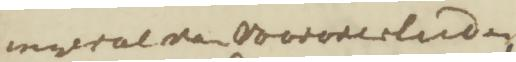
ingeval van vooroverleiden
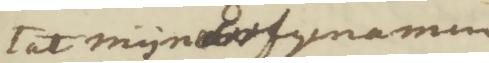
tot mijn erfgenamen
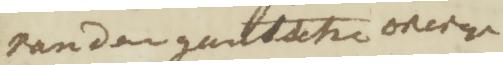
van den gantsche overge
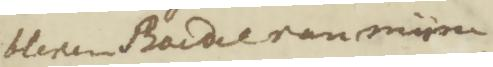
bleven Boedel van mijne
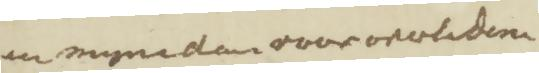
en myne dan voor overleden
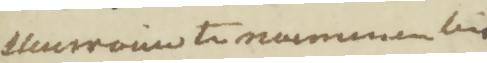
Huisvrouw te noemen en bij
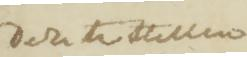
deze te stellen
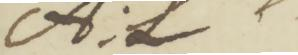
A:L qq
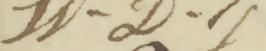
W-D-G
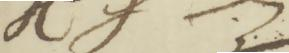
H F h
